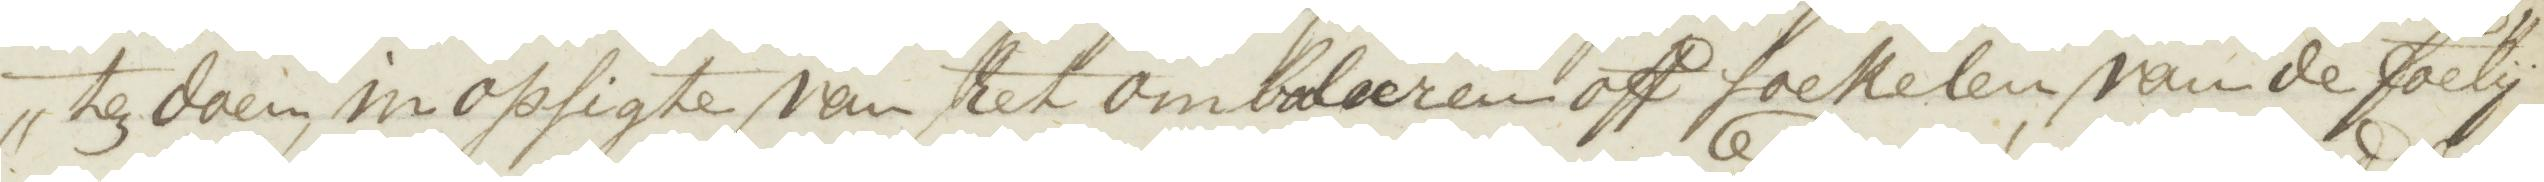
„ten doen in opsigte van het om balieren off soekelen van de foelij
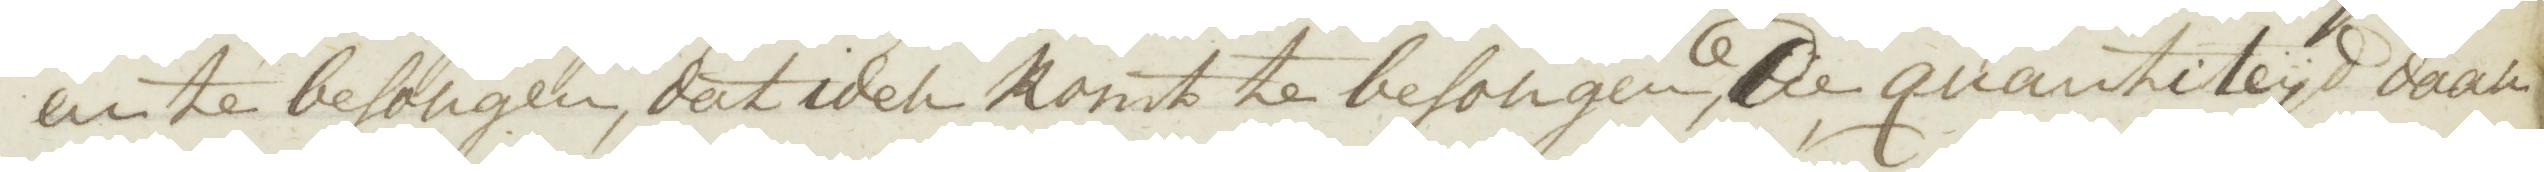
en te besorgen, dat ider komt te besorgen, de quantiteijd daar
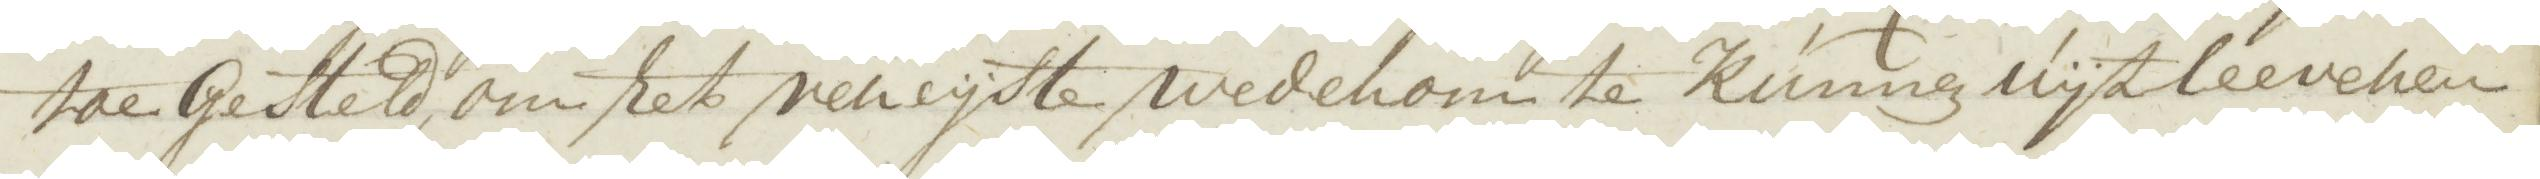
toe gesteld, om het vereijste wederom te kunnen uijt leeveren
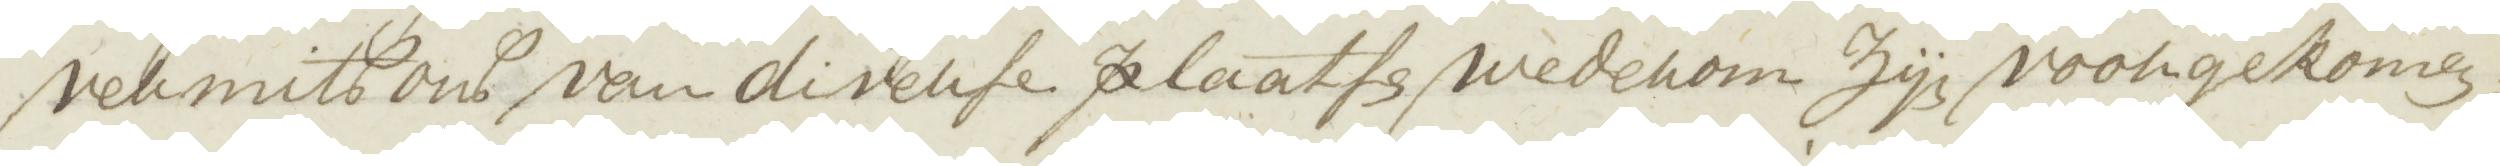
vermits ons van diverse plaatsen wederom zijn voorgekomen,
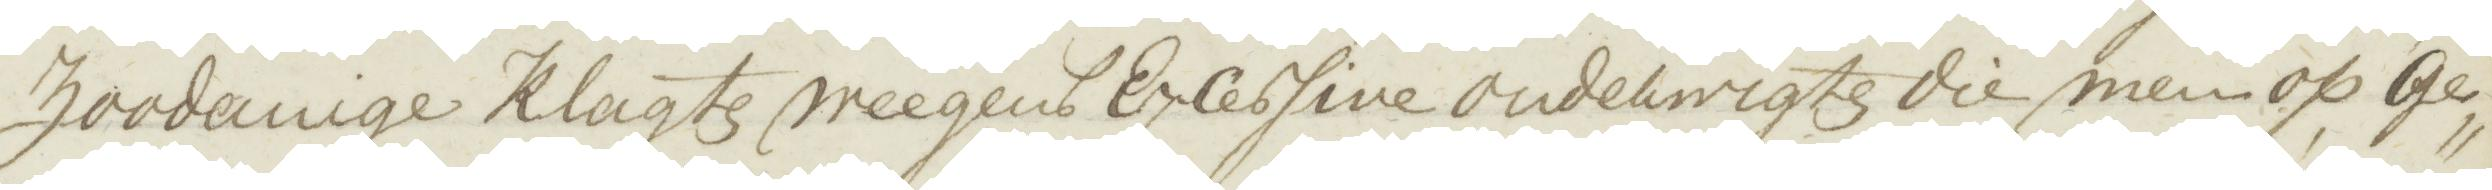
zoodanige klagten weegens Excessive onderwigten die men op ge„
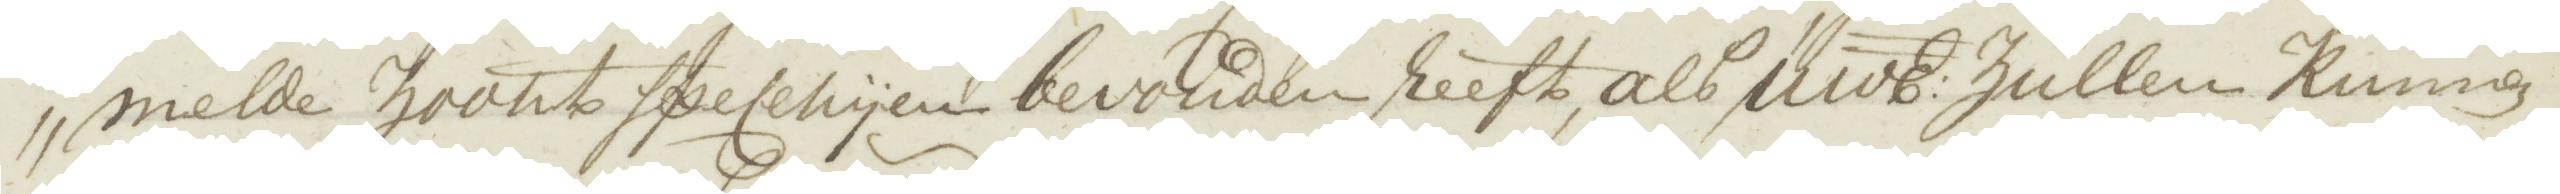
„melde zoort specerijen bevonden heeft, als uwE: zullen kunnen
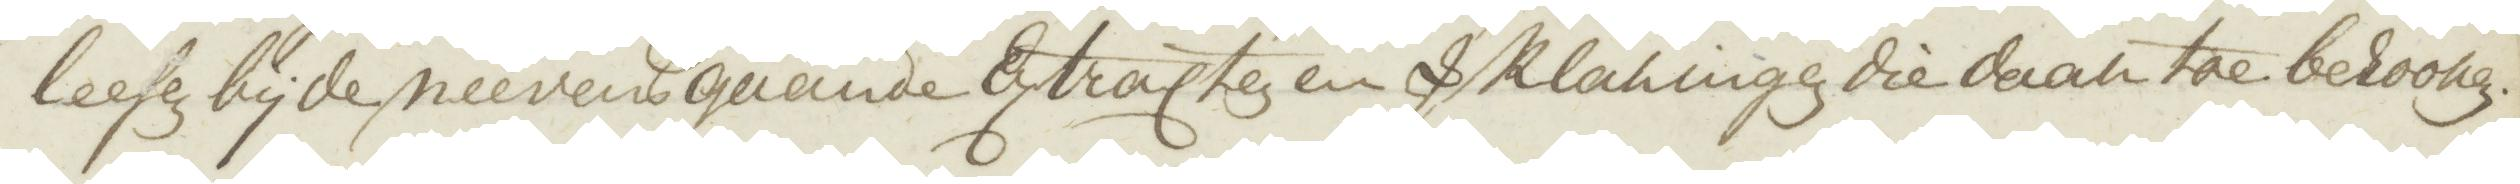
leesen bij de neevens gaande Extracten en verklaringen die daar toe behooren.
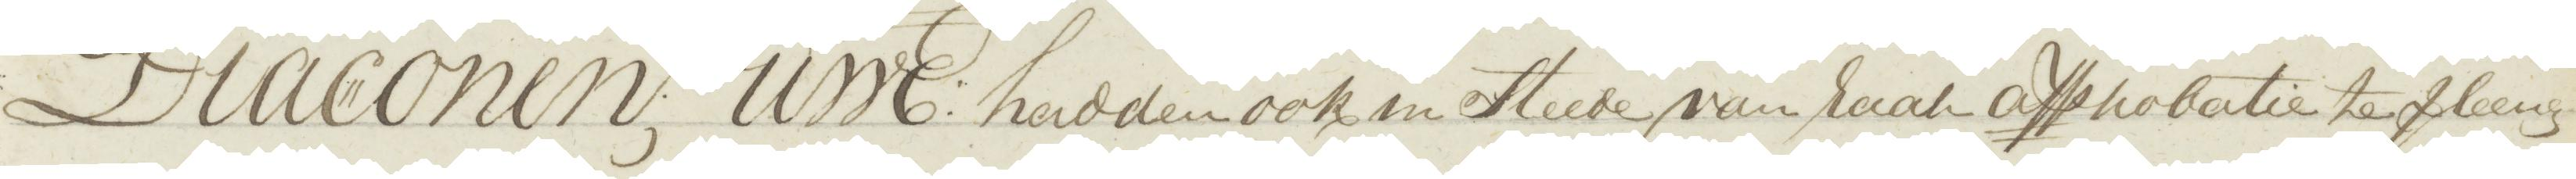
Diaconen; uwE: hadden ook in steede van haar approbatie te verleenen
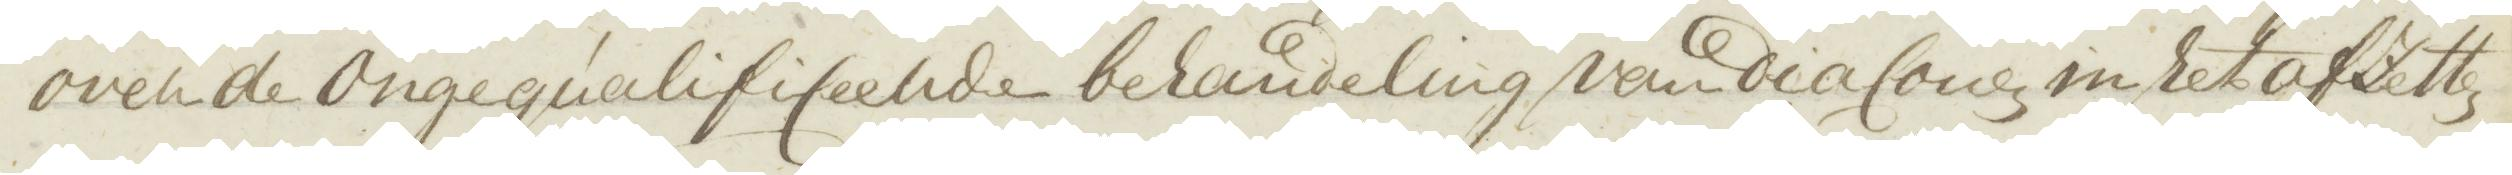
over de ongequalificeerde behandeling van diaconen in het afzetten
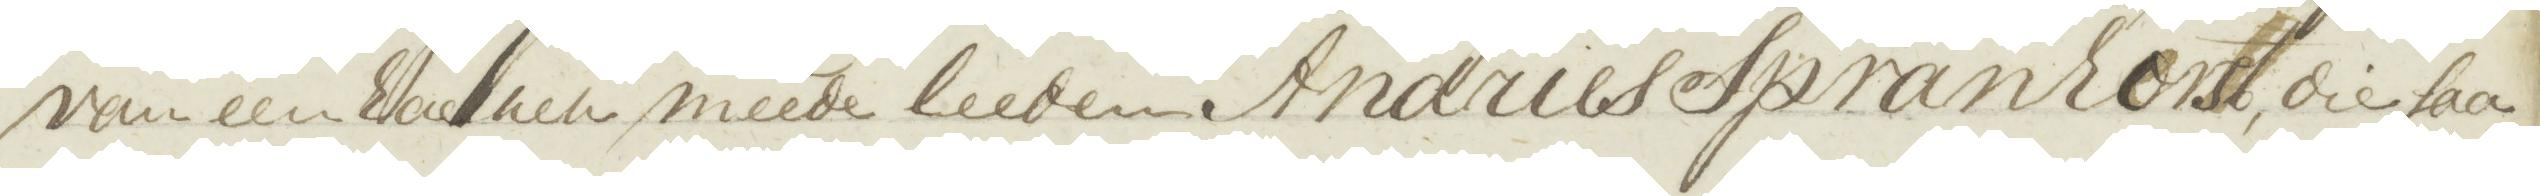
van een haarer meede leeden Andries Spranhorst, die saa
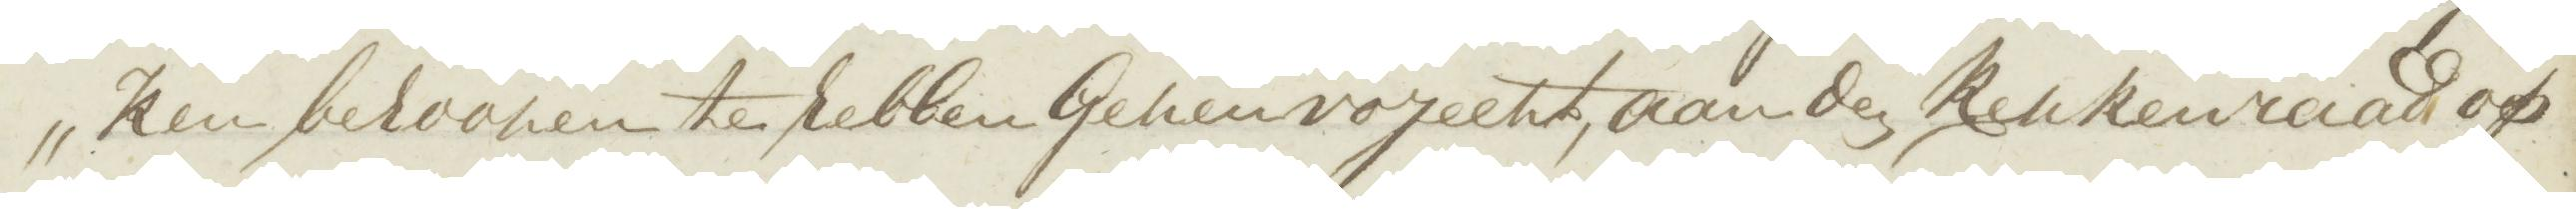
„ken behooren te hebben gerenvojeert, aan den kerkenraad op
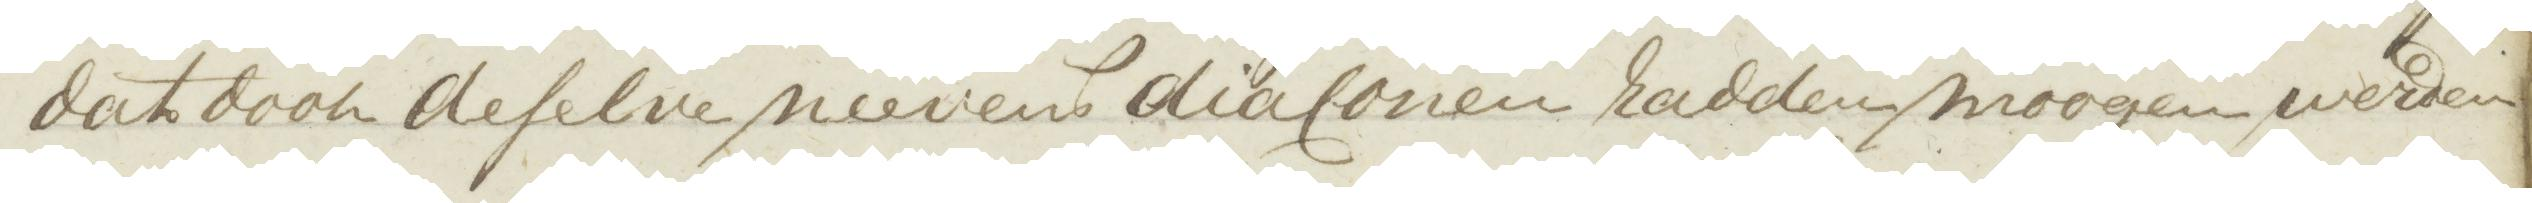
dat door deselve neevens diaconen hadden moogen werden
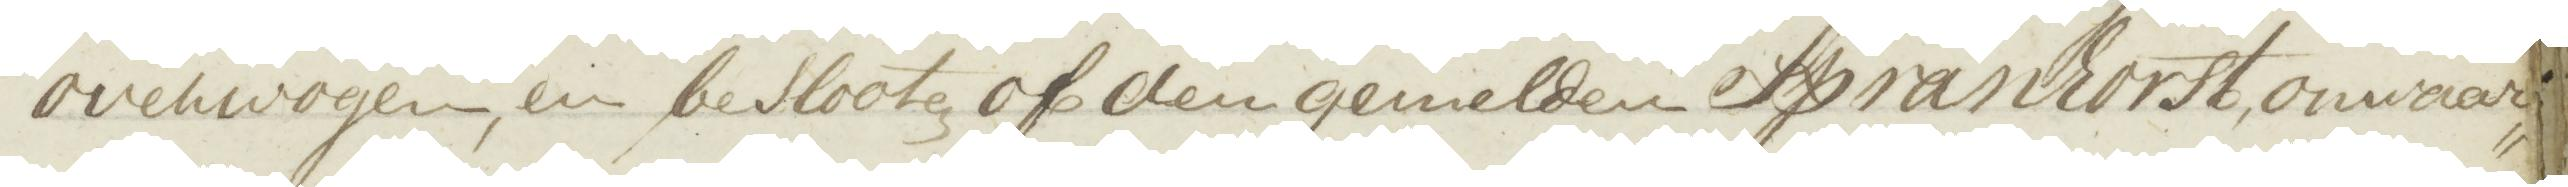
overwogen, en beslooten of den gemelden Spranhorst, onwaar„
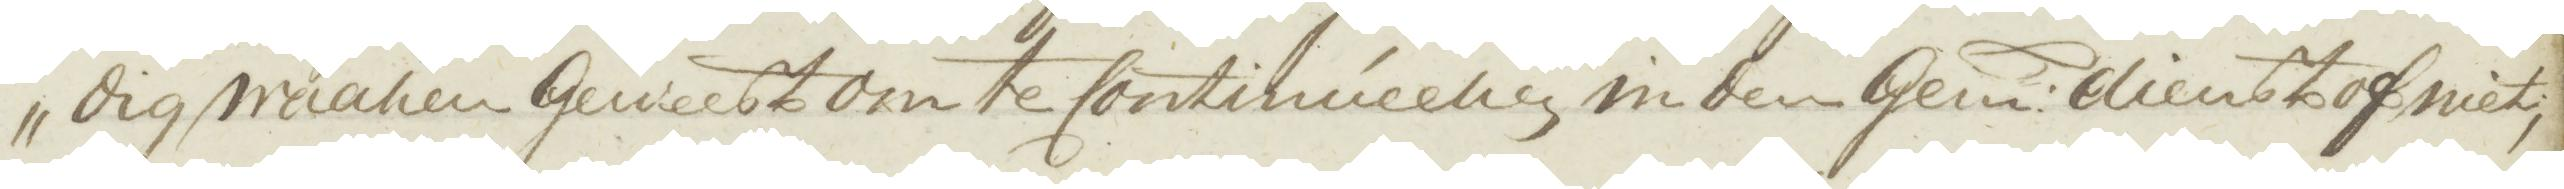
„dig waaren geweest om te Continueeren in den gem: dienst of niet,
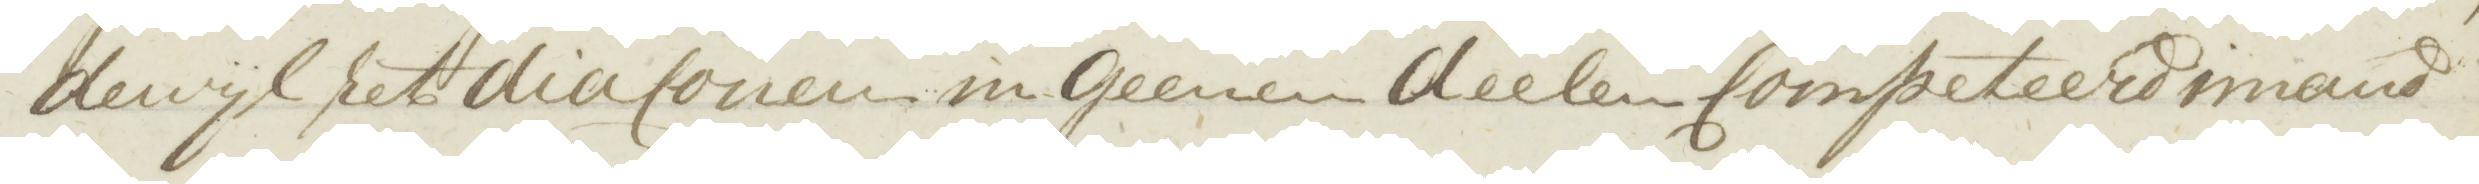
dewijl het diaconen in geenen deelen Competeerd imand
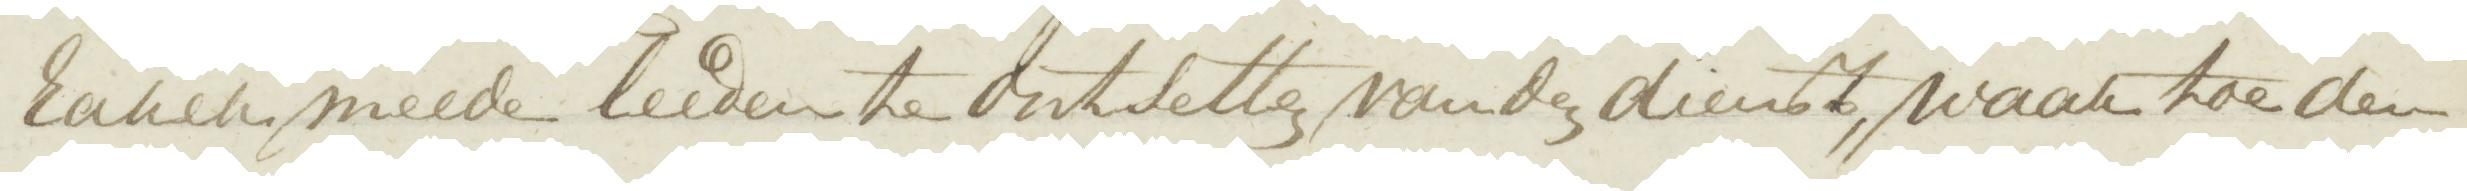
harer meede leeden te ontsetten van den dienst, waar toe den
